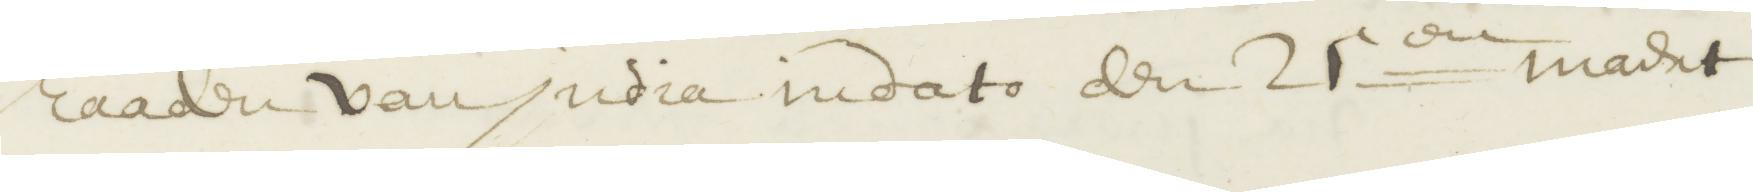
raaden van jndia in dato den 25=en maert
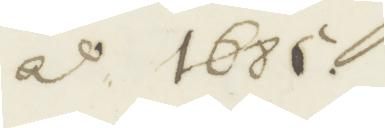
a„o 1685.
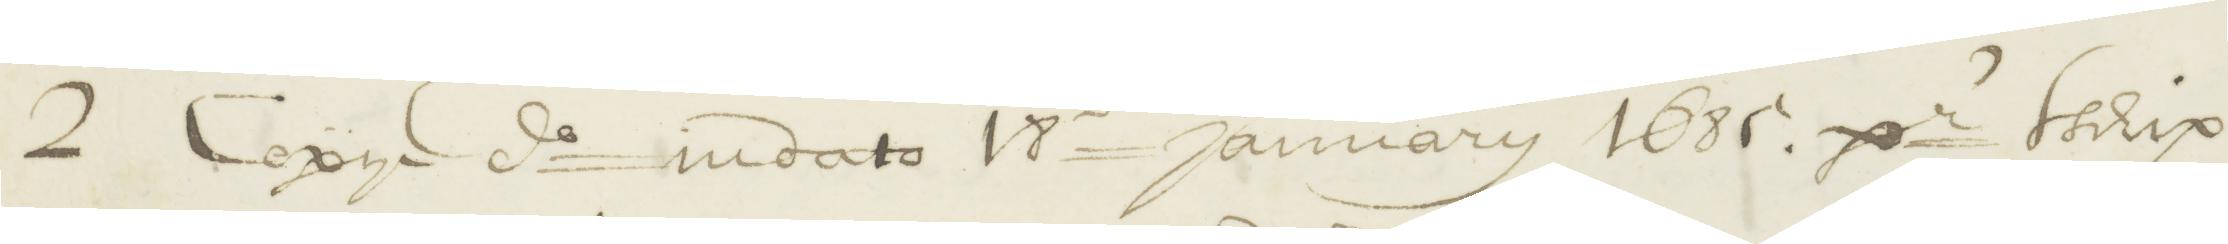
2 Copije d=o indato 18=' Januarij 1685. p=r 'tschip
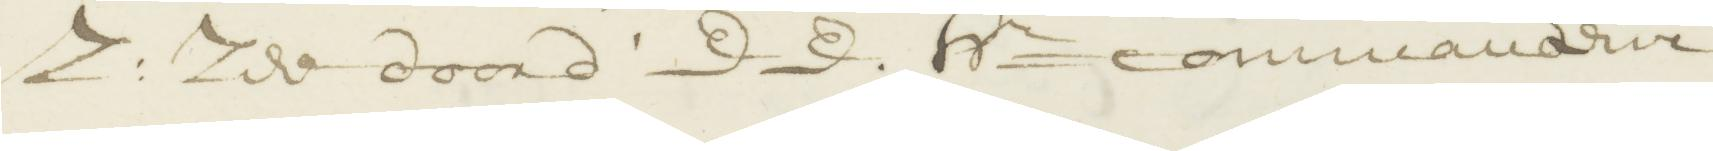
z: zee door d’ E E. H=r commandeur
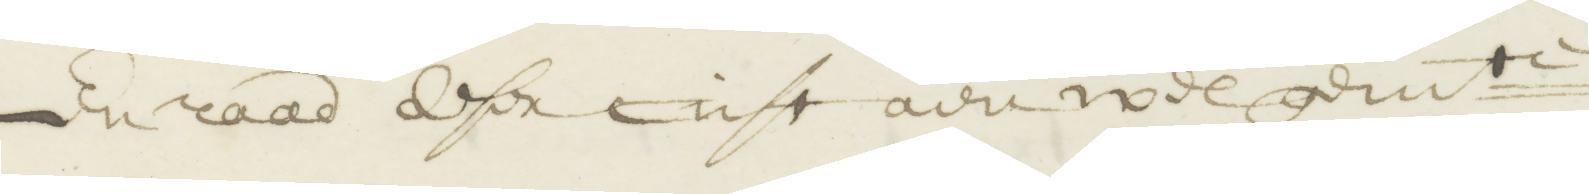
En raad deser cust aen wel gem=te
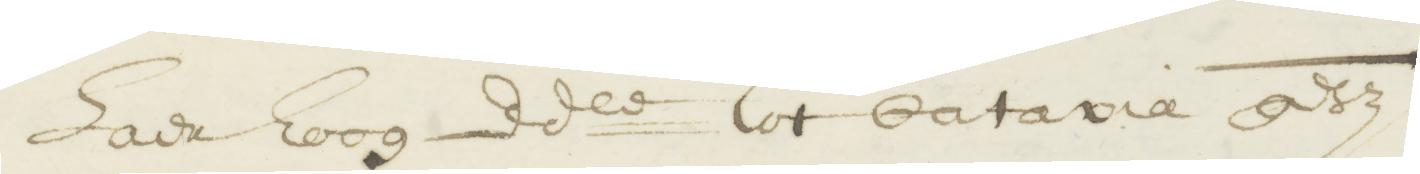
haer hoog Ed=le tot batavia gesz.
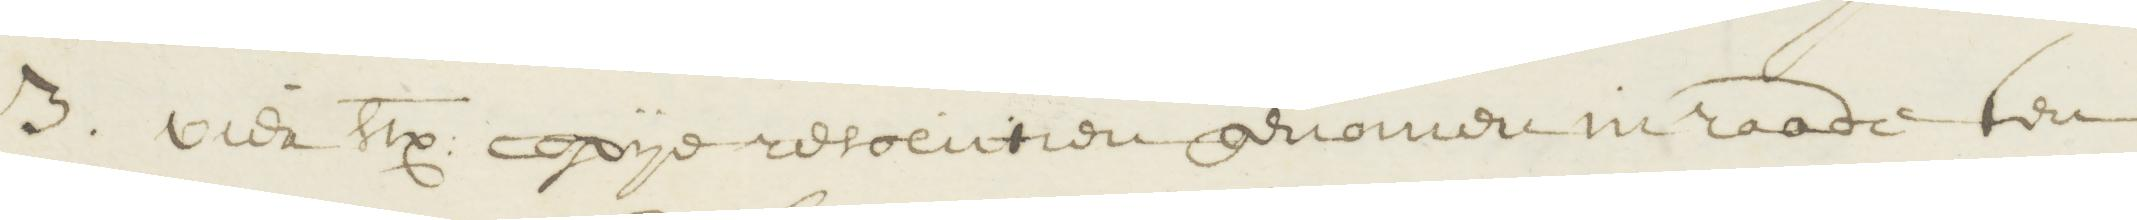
3. vier stx: copije resolutien genomen in raade ten
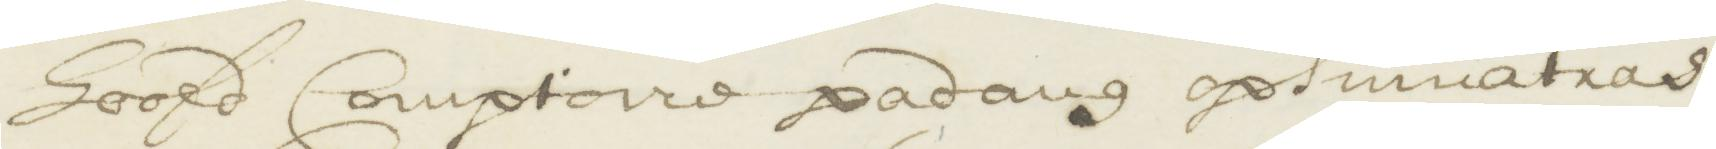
hoofd Comptoire padang op sumatras
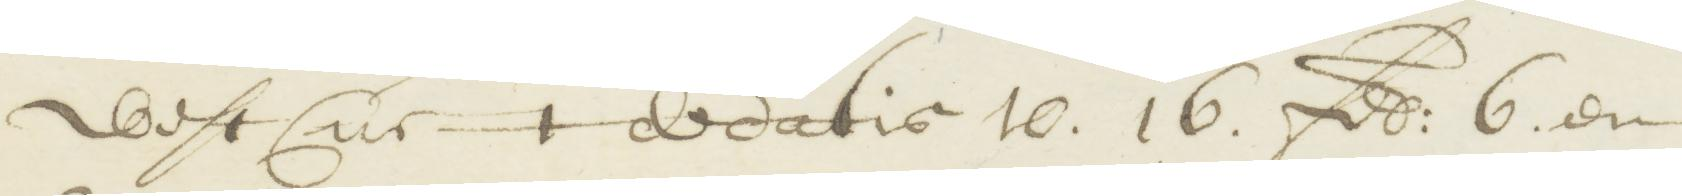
west Cust de datis 10. 16. feb: 6. en
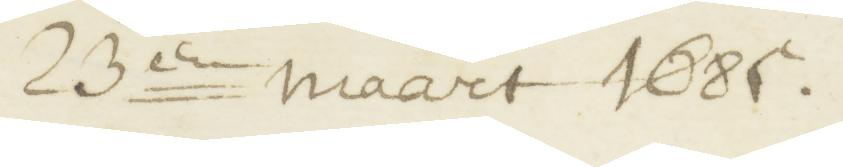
23=en maart 1685.
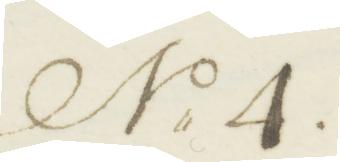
N„o 4.
